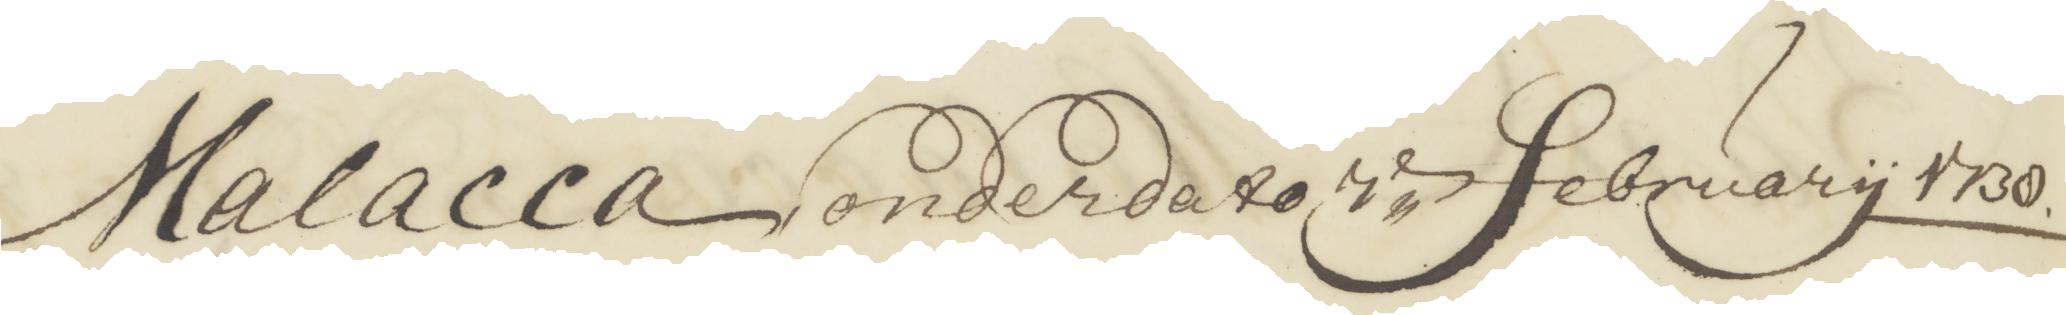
Van Malacca, onderdato 7„en Februarij 1738.
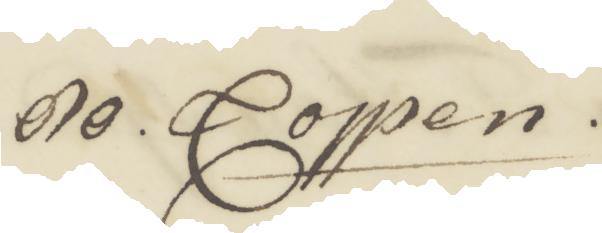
80. Coppen.
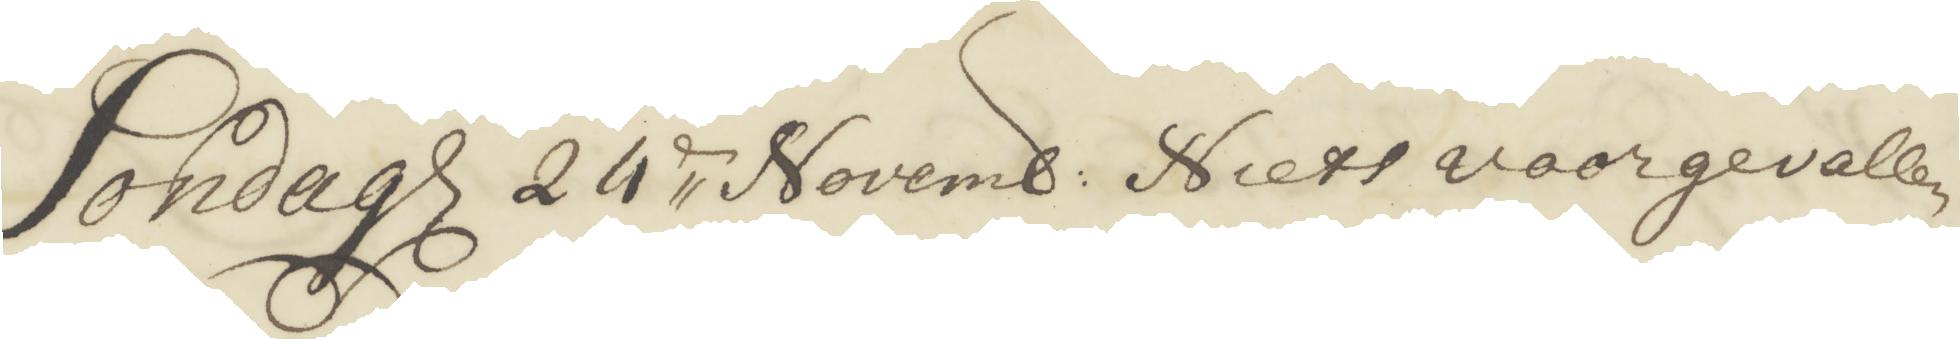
Sondagh 24„en Novemb: Niets voorgevallen.
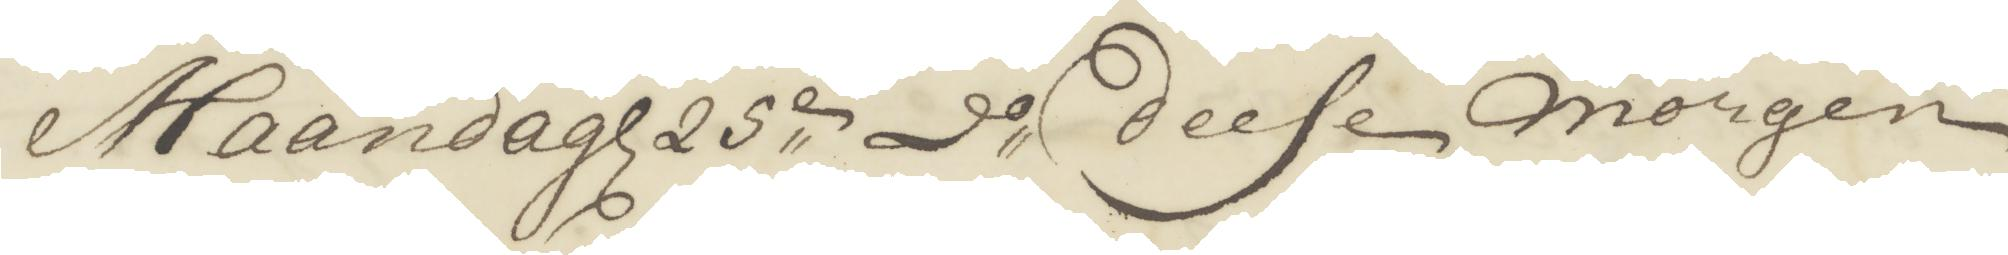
Maandagh 25„en _„o deese morgen
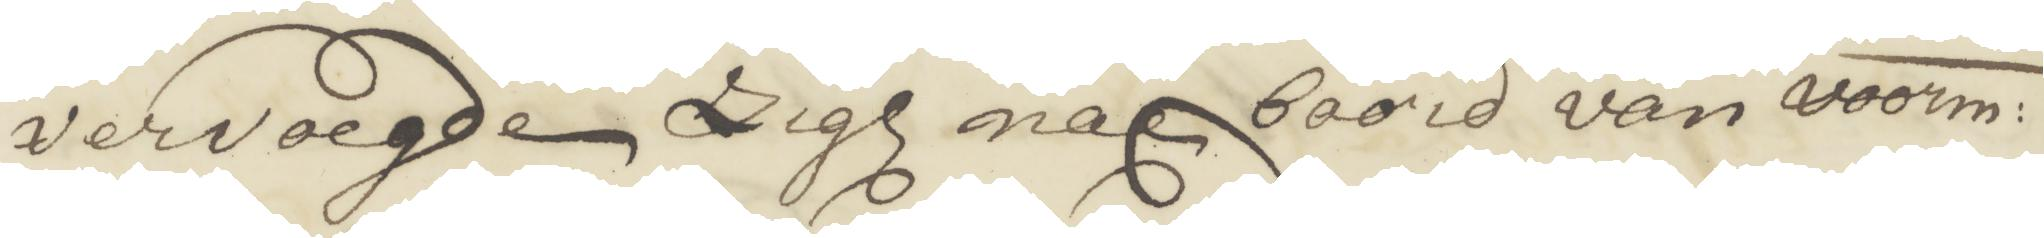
vervoegde zigh nae boord van voorm:
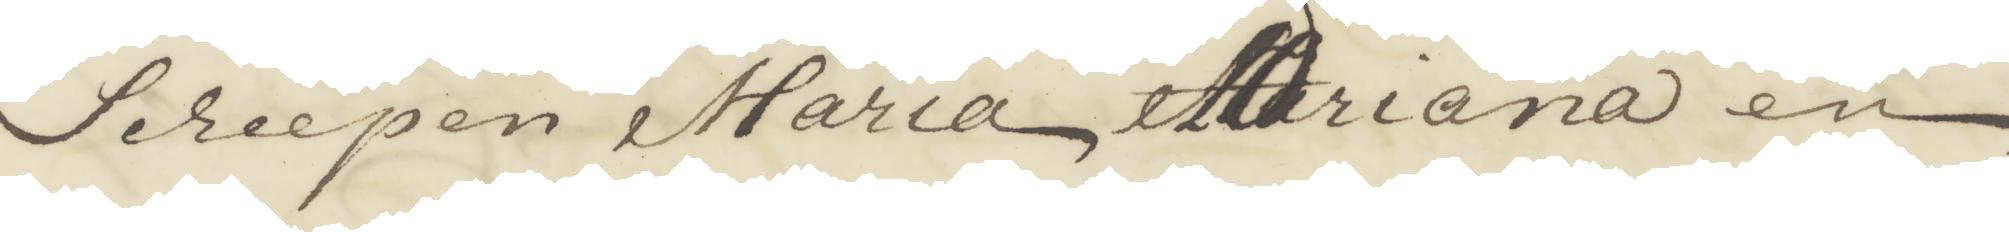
scheepen Maria Adriana en
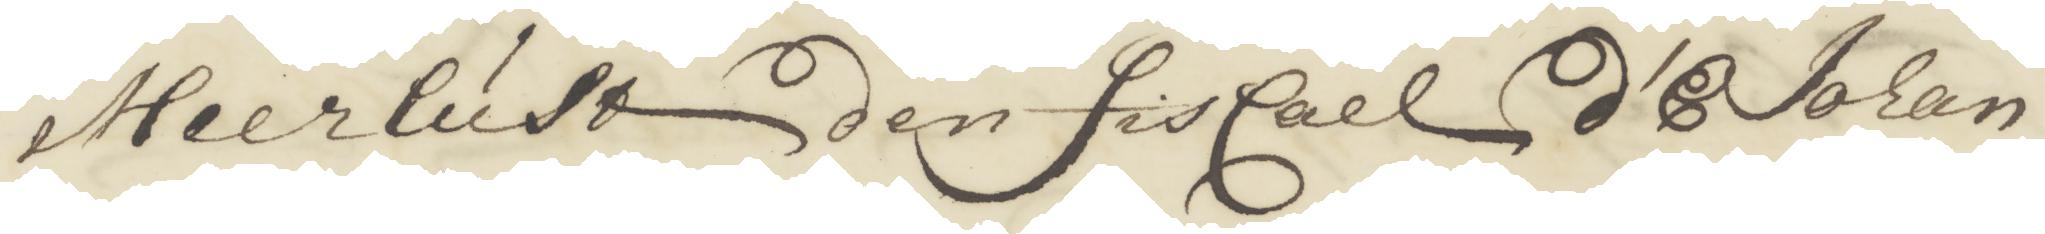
Meerlust den fiscael d’E Johan
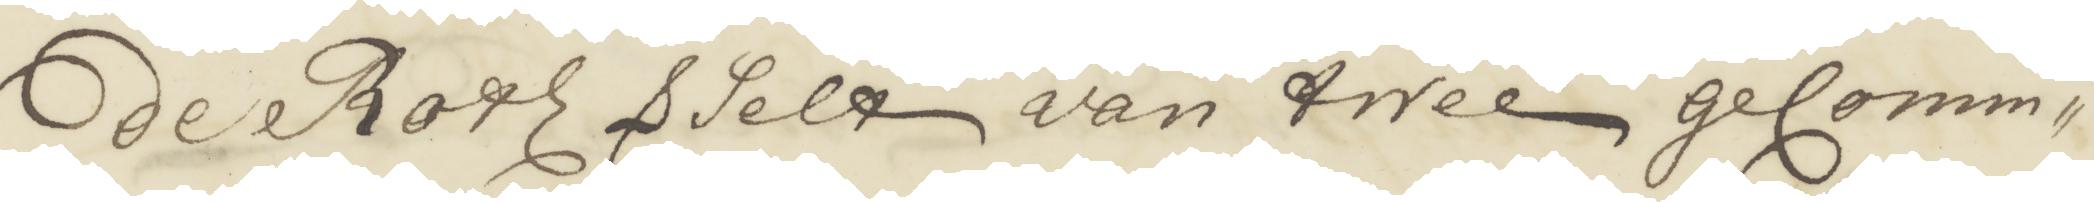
de Roth verselt van twee gecomm„e
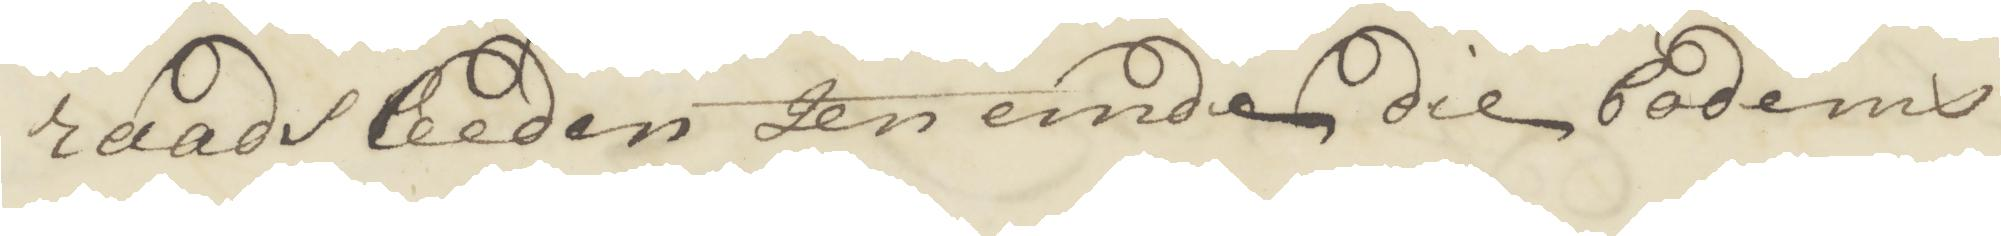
raads leeden ten einde die bodems
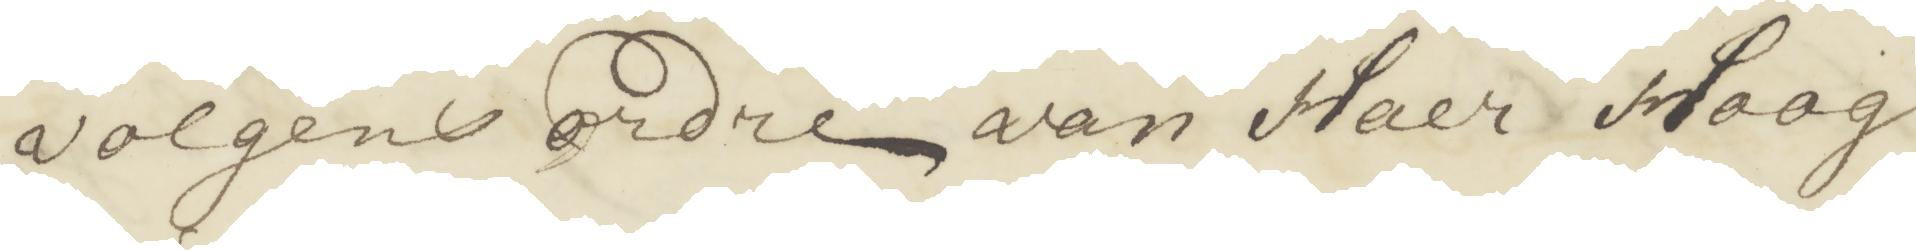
volgens ordre van Haer Hoogh
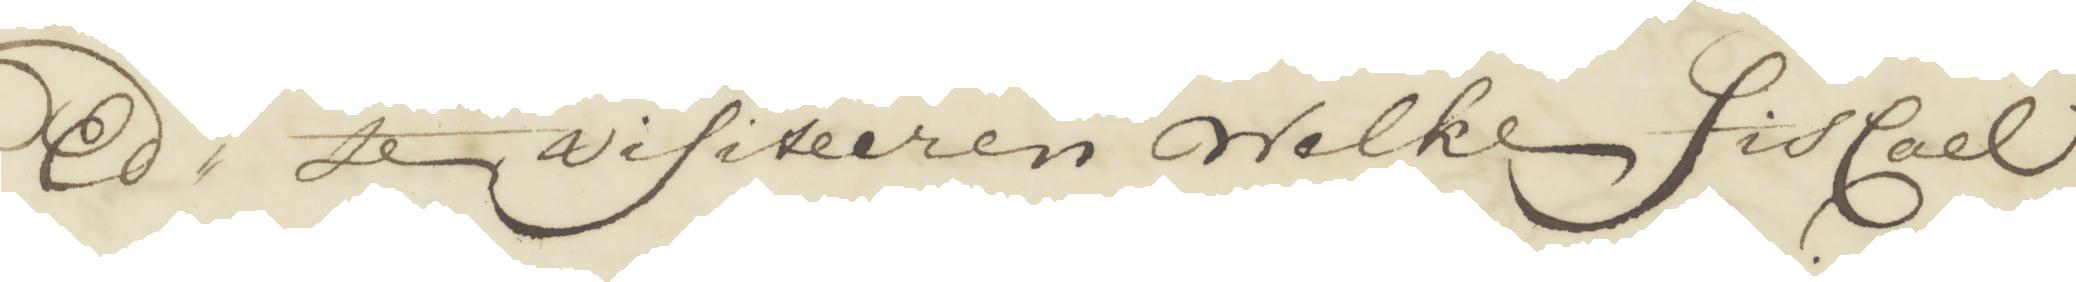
Ed„s te visiteeren welke fiscael
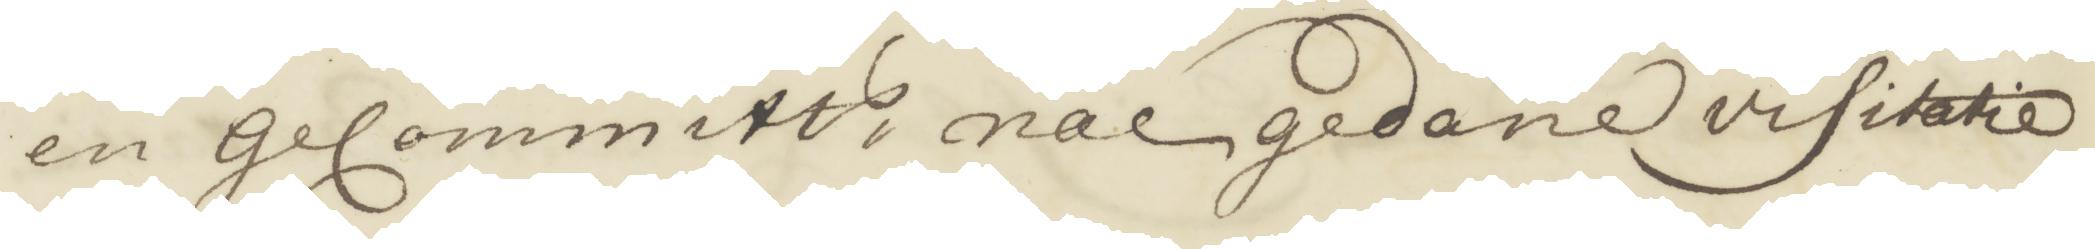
en gecommitt„s nae gedane visitatie
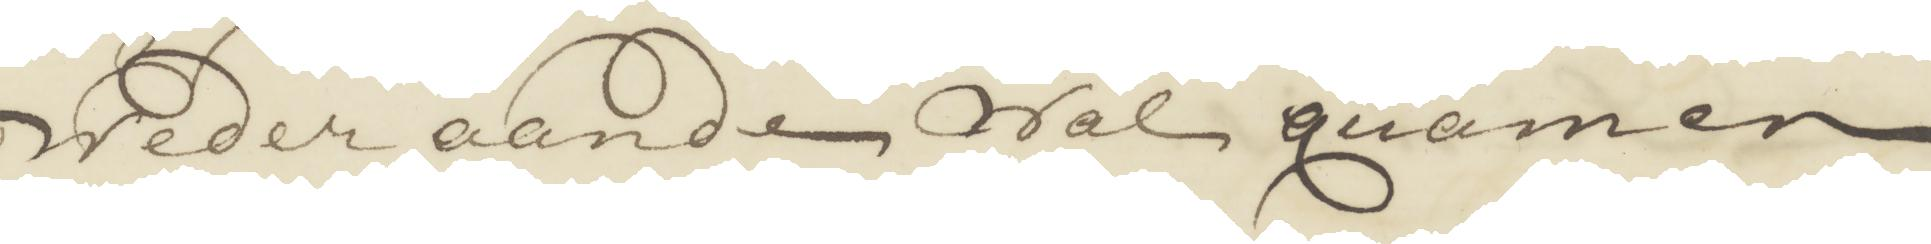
weder aande wal quamen
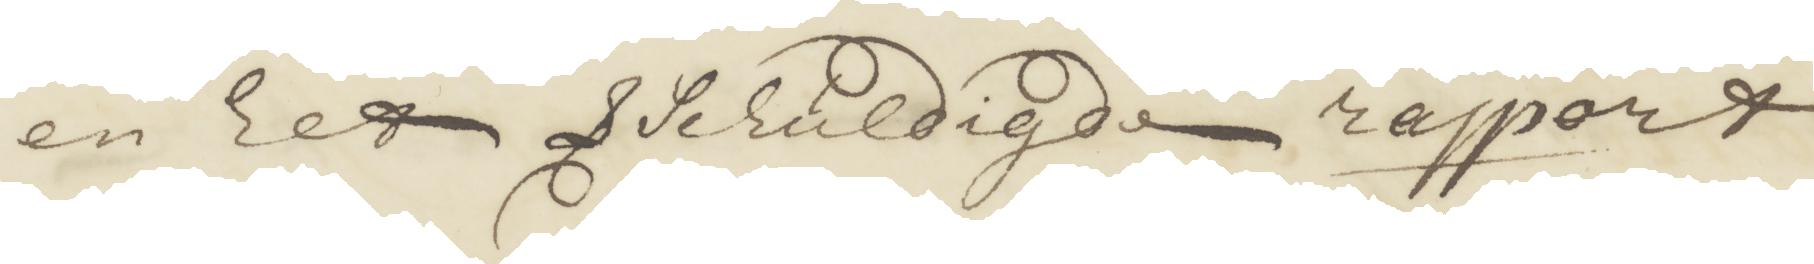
en het verschuldigde rapport
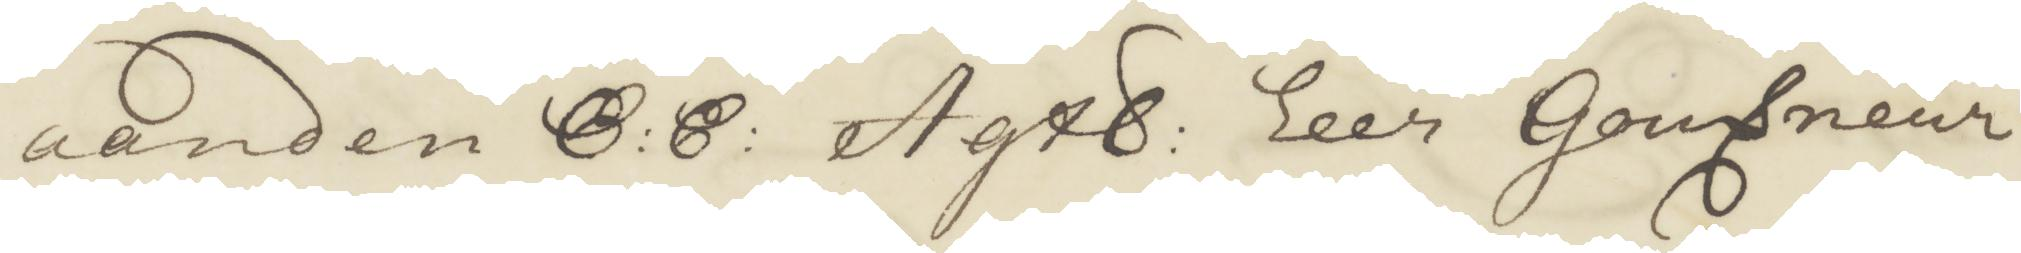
aan den E:E: Agtb: heer Gouverneur
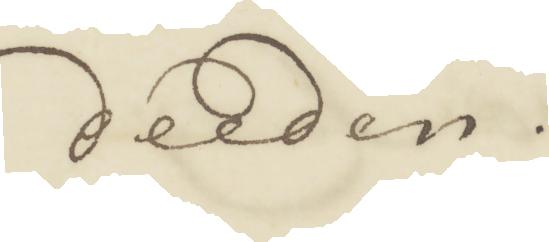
deeden.
